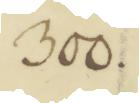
300.
